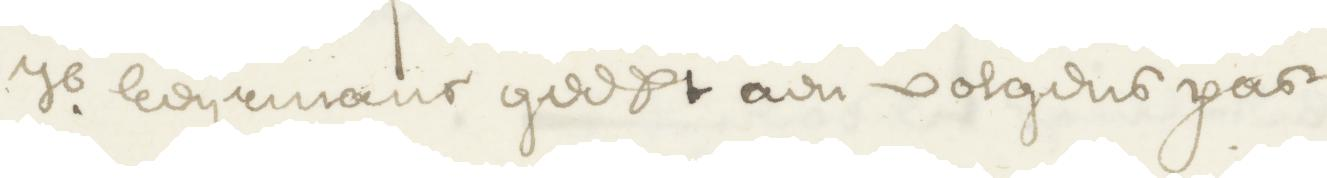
J.b heijrmans geeft aen volgens pas
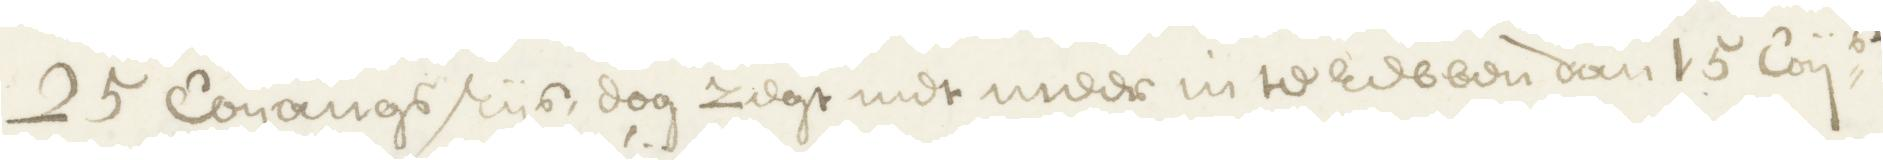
25 Coijangs rijs, dog zegt niet meer in te hebben dan 15 Coij„s
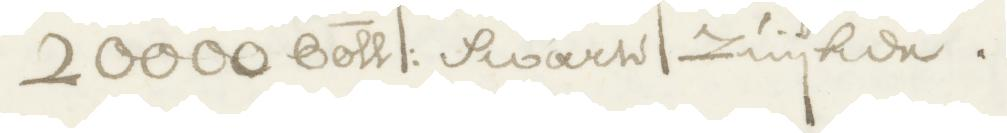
20000 boll: swarte zuijker.
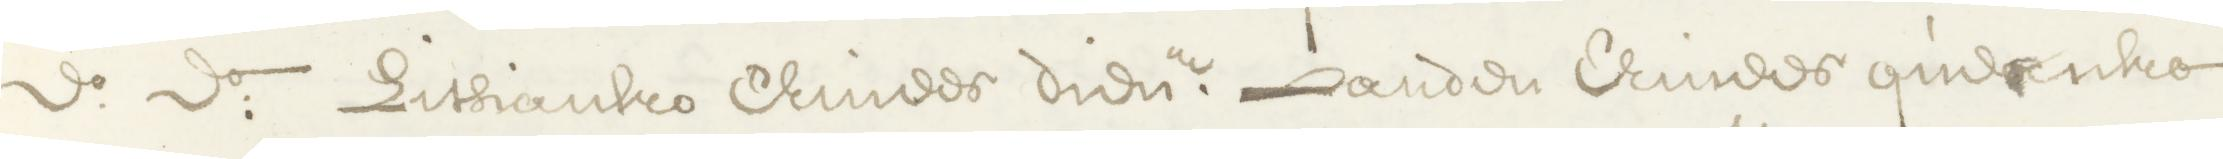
d.o d:o Lithianko Chinees dien. van den Chinees quenko
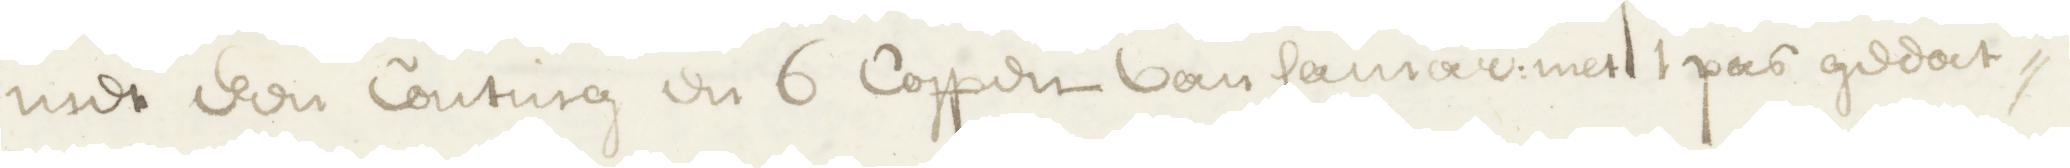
met een Conting en 6 Coppen van samar: met 1 pas gedat„
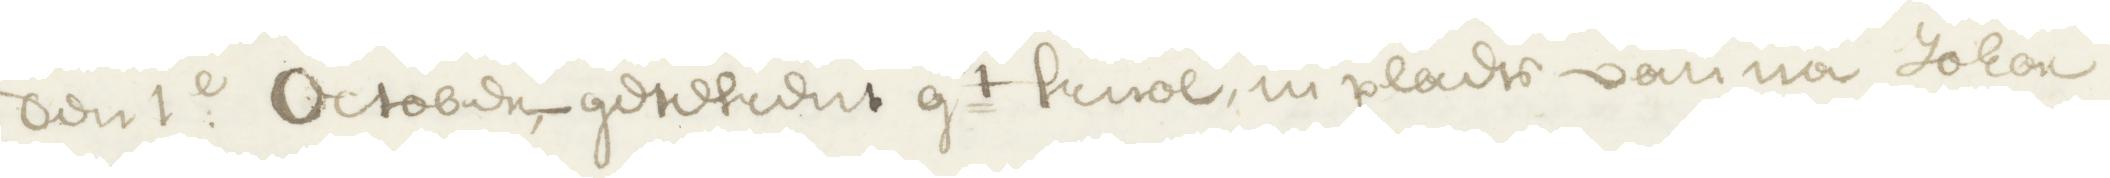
den 1:e October getekent g=t knol, in plaets van na Iohor
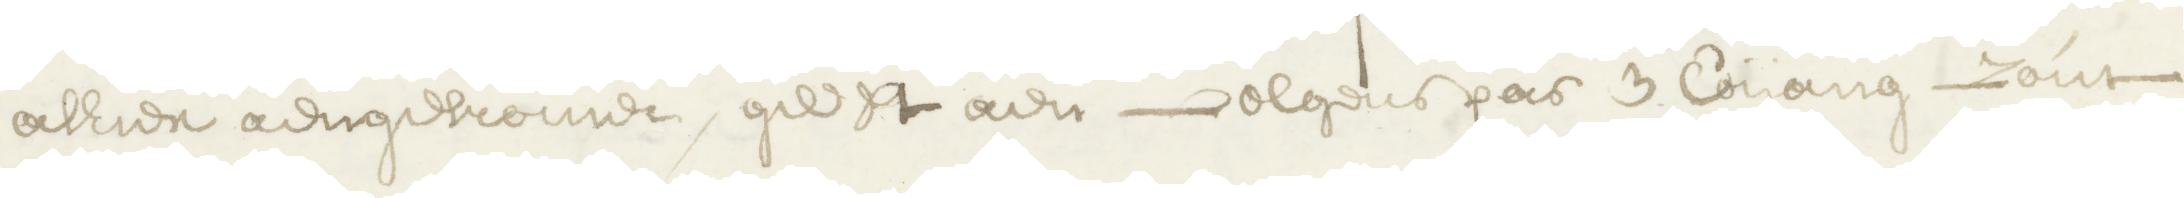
alhier aengekomen, geeft aen volgens pas 3 Coijang zout
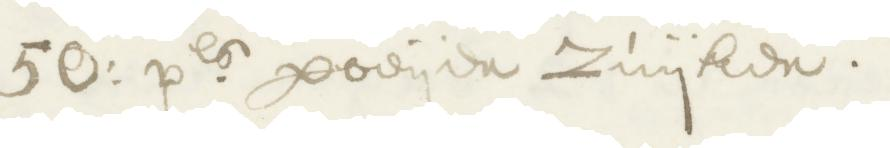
50: p:ls poeijer zuijker.
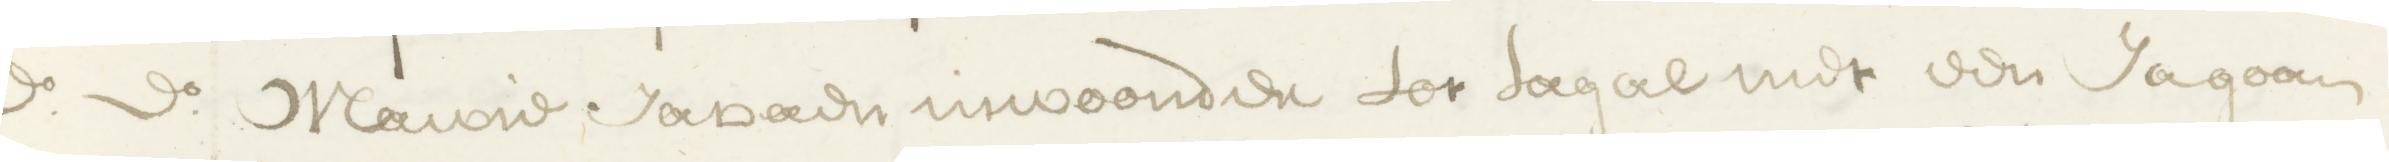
d.o d.o Mawie Iavaen inwoonder tot tagal met een Iagoan
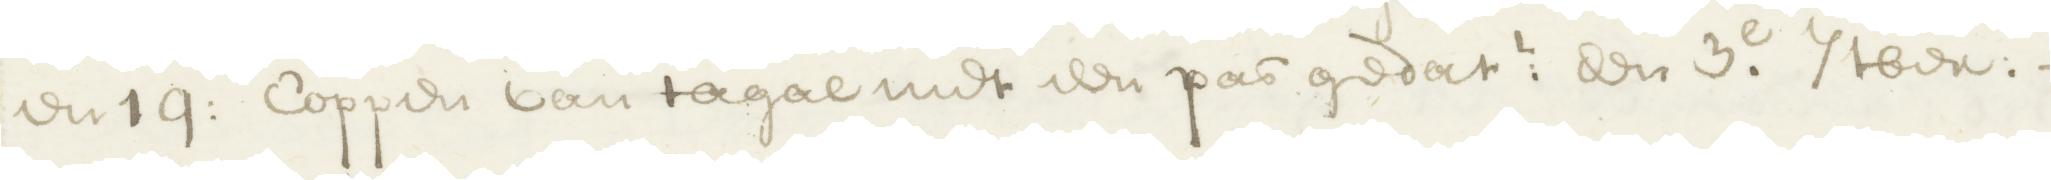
en 19: Coppen van tagal met een pas gedat:t den 3.e 7tber:
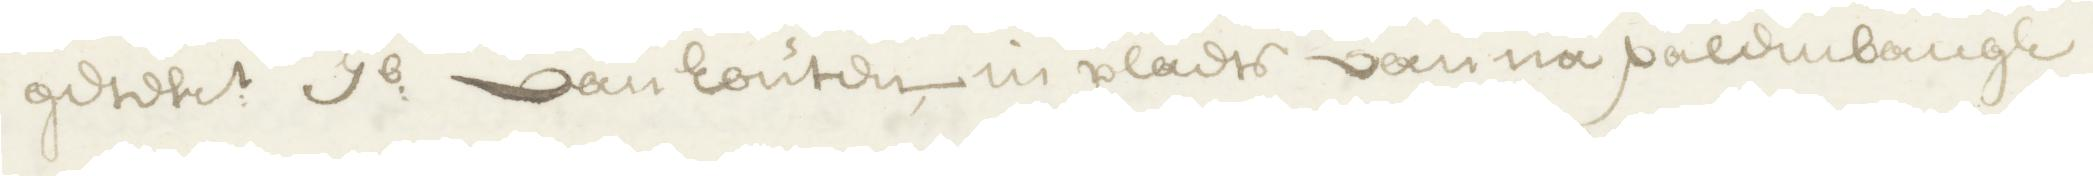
getek:t I:b van houten, in plaets van na palembangh
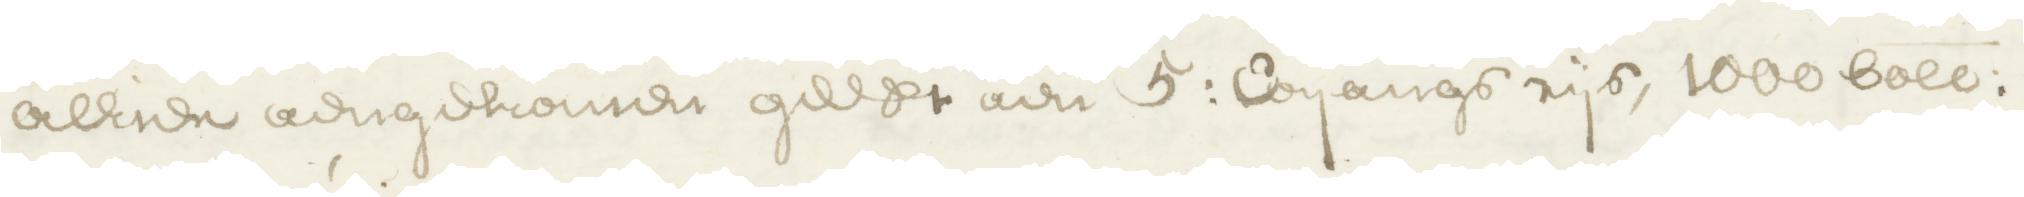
alhier aengekomen geeft aen 5: Coijangs rijs, 1000 boll:
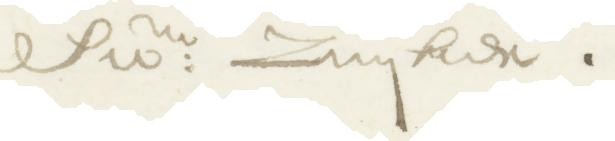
sw: zuijker.
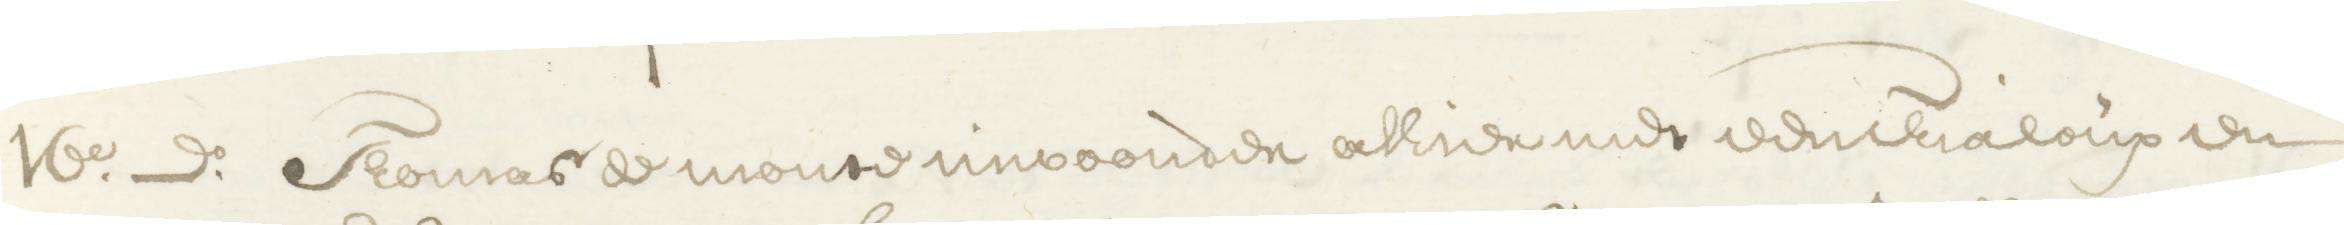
16.e d.o Thomas de monte inwoonder alhier met een Chialoup en
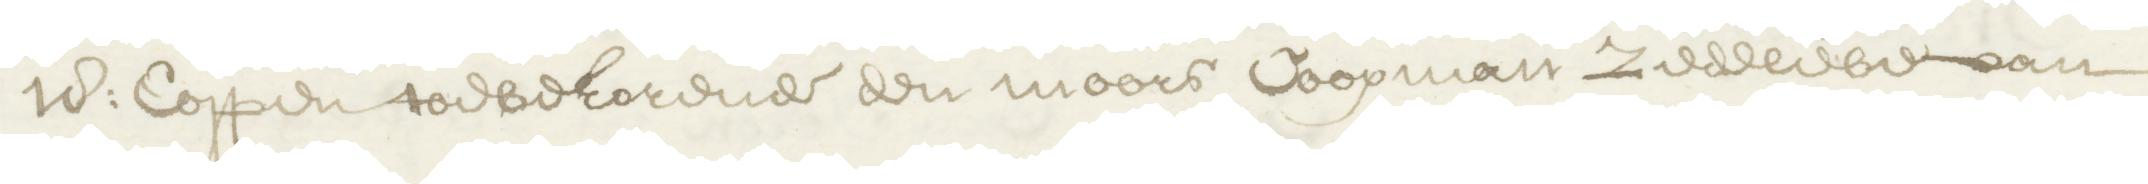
18: Coppen toebehorende den moors Coopman zedelebe van
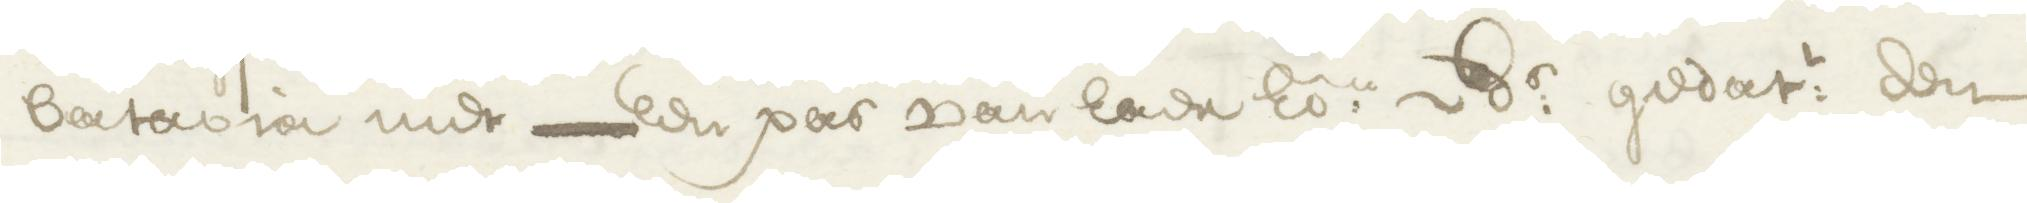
batavia met — een pas van haer ho: Ed:s gedat:t den
